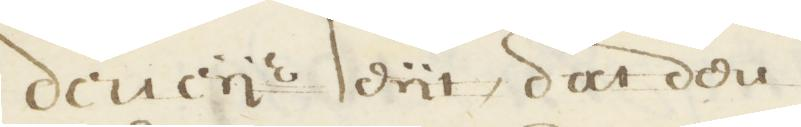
den eij=r Seijt, dat den
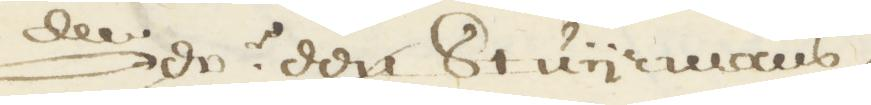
Gev:e een Stuijrmans
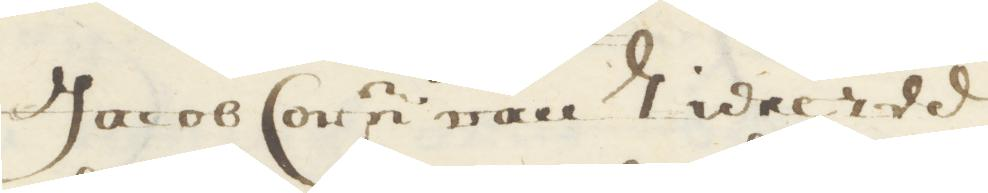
Jacob Corn van Zierczee
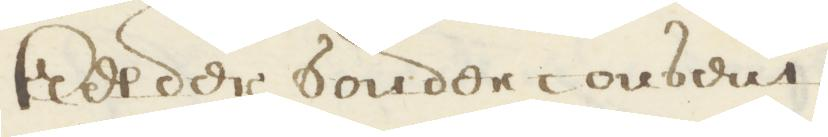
kelder sonder consent
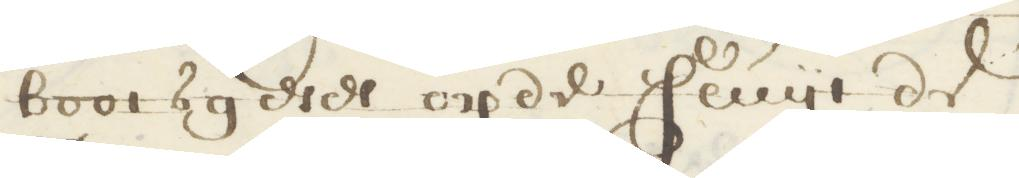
bootsgesel op de Fluijt de
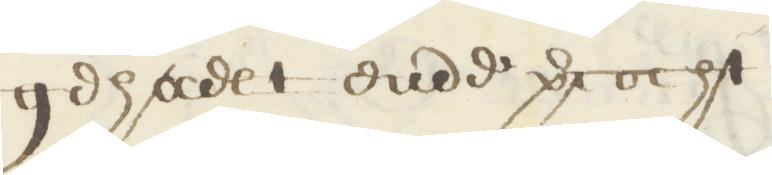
gehaelt ende vercocht
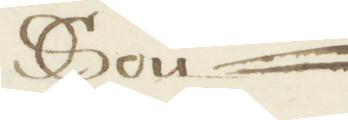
Son Gev.e
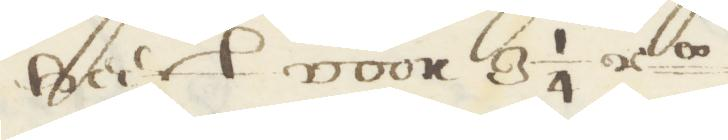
heeft voor 3¼ r=a
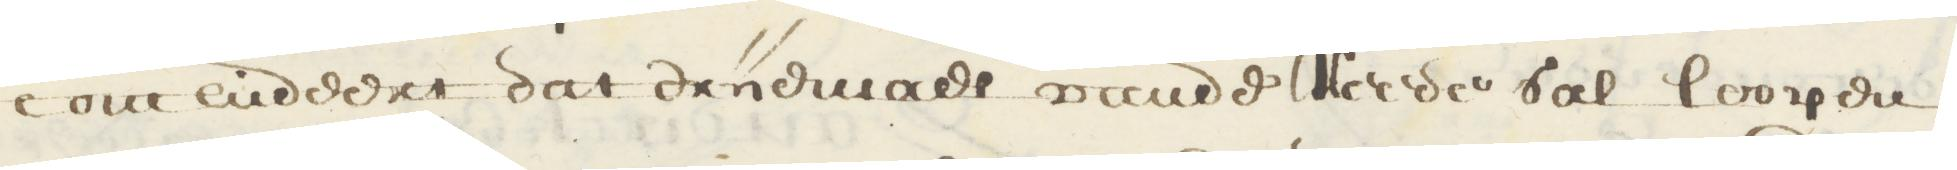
concludeert dat drijemael vande Reede sal loopen
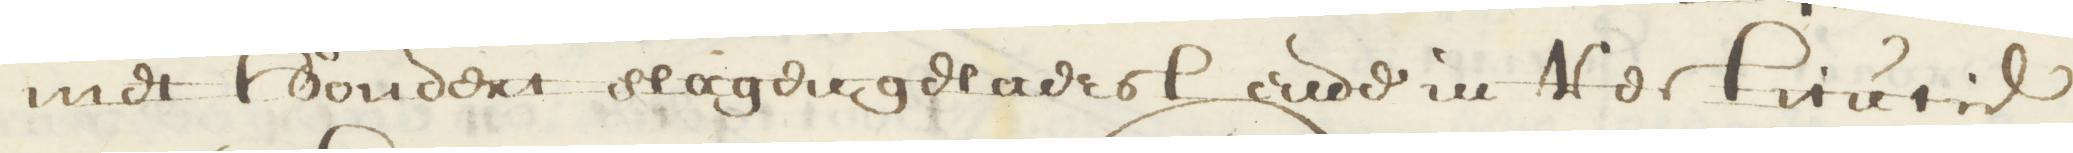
met Hondert slagengelaerst ende in Restitutie
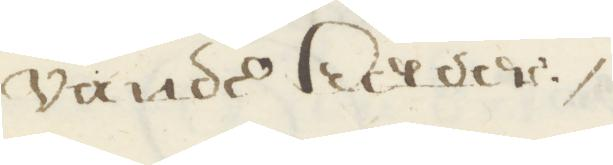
vande kelder./
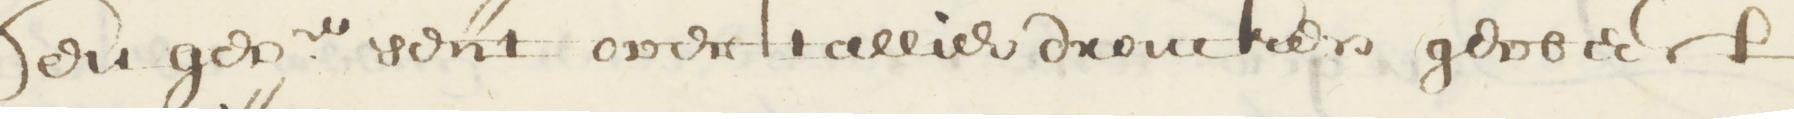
Den gev:e seijt over Stallich droncken geweest
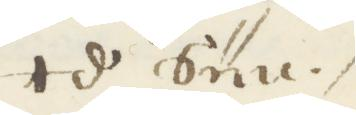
te sijn./
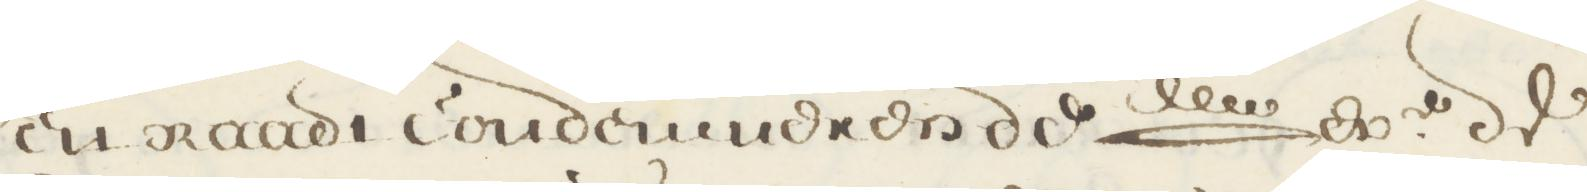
Den raadt condemneren de Gev.e de
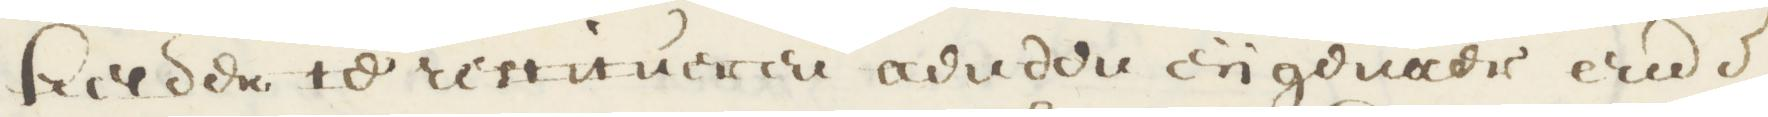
kelder te restitueren aen den eijgenaer ende
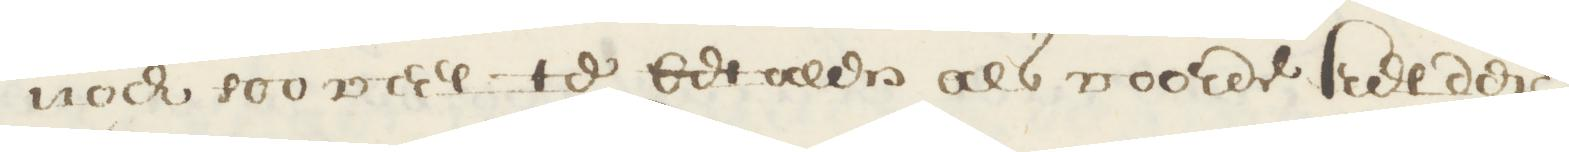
noch soo veel te betalen als voorde kelder
